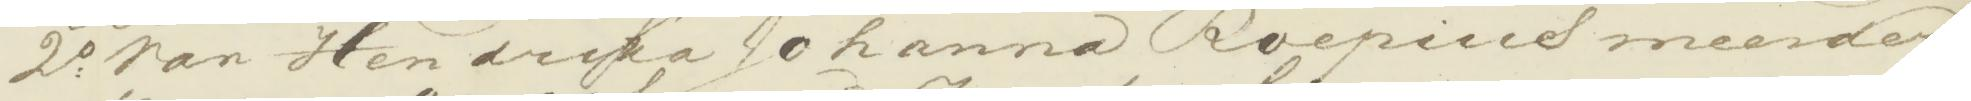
2: van Hendrika Johanna Roepius meerder
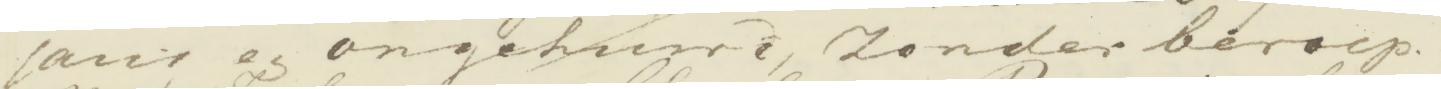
=jarig en ongehuwd, zonder beroep.
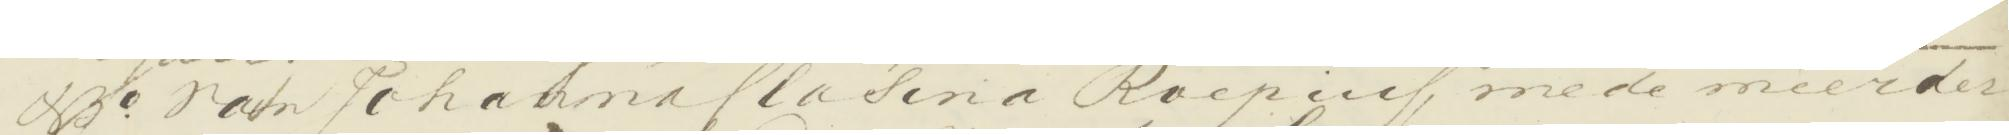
3.o van Johanna Clasina Roepius, mede meerder
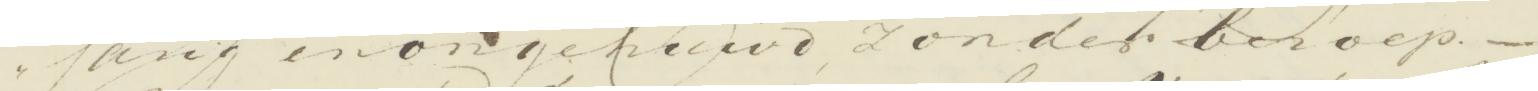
„jarig en ongehuwd, zonder beroep.-
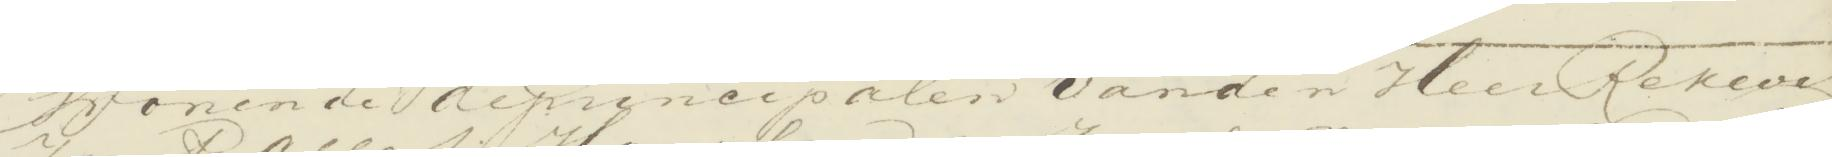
Wonende de principalen van den Heer Rekwi
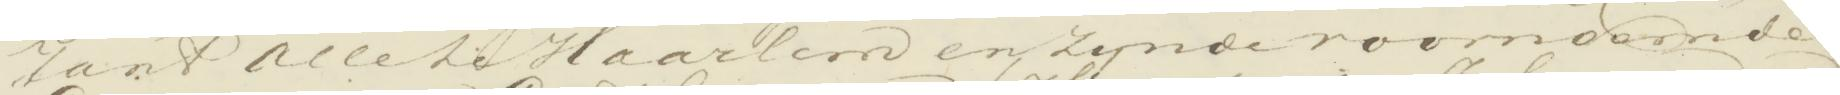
rant alle te Haarlem en zynde voornoemde
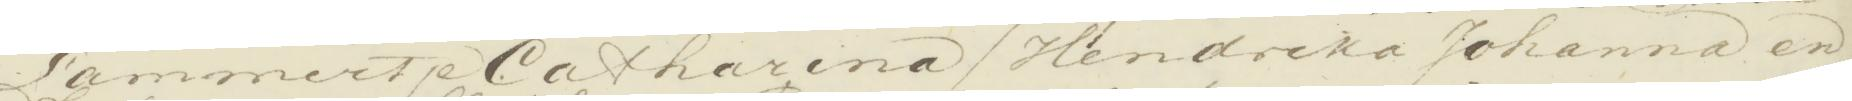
Lammertje Catharina / Hendrika Johanna en
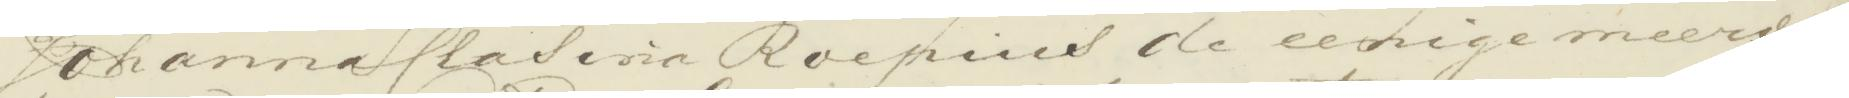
Johanna Clasina Roepius de eenige meerder
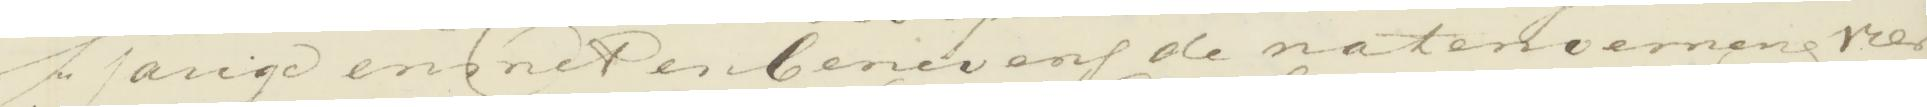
„jarige en met en benevens de natenoemene vier
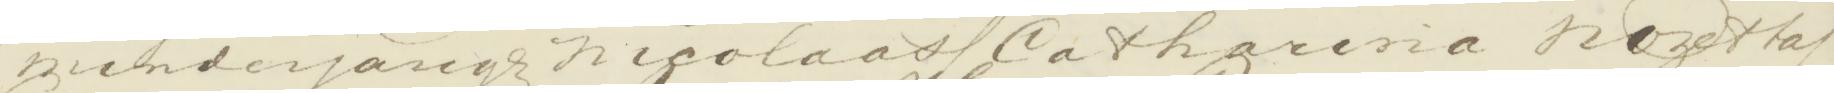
minderjarigen Nicolaas Catharina Rozettas
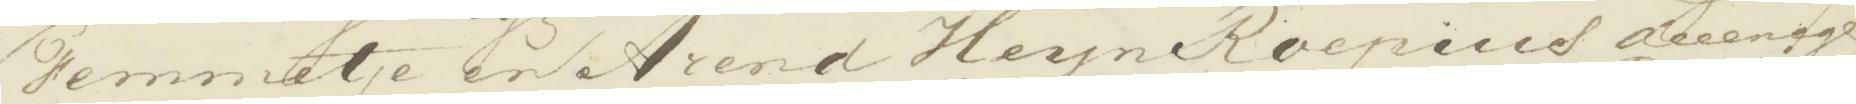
Femmetje en Arend Heyn Roepius de eenige
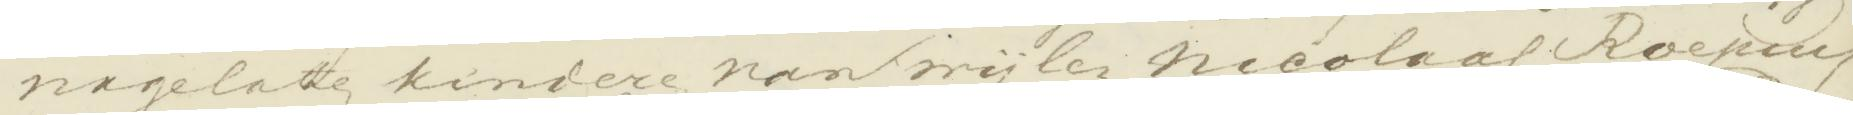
nagelate kindere van wijlen Nicolaas Roepius
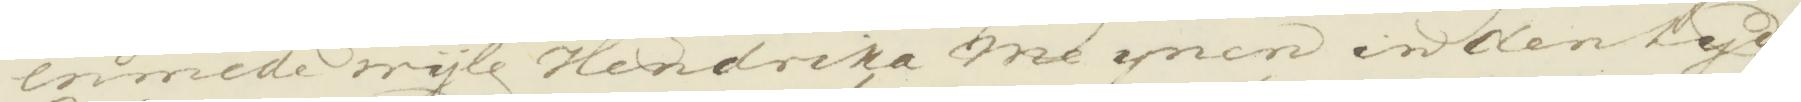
en mede wijle Hendrika Meynen in den tyd
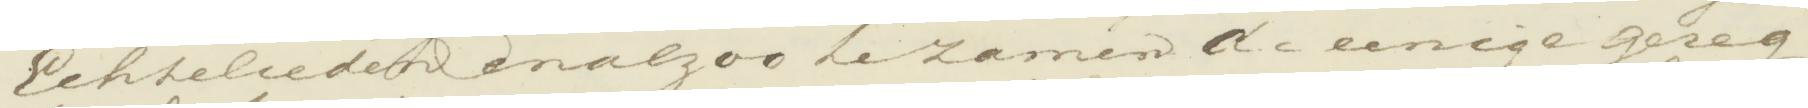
Echtelieden en alzoo te zamen de eenige gereg
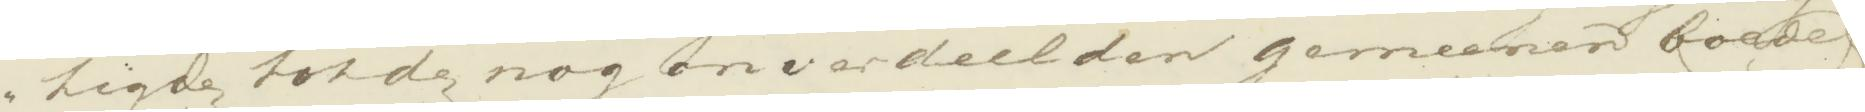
„tigde tot de nog onverdeelden gemeenen boedel
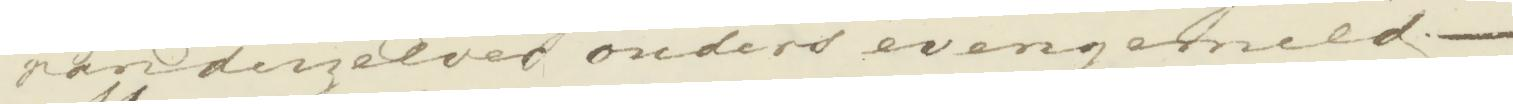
van dezelve ouders evengemeld.—
